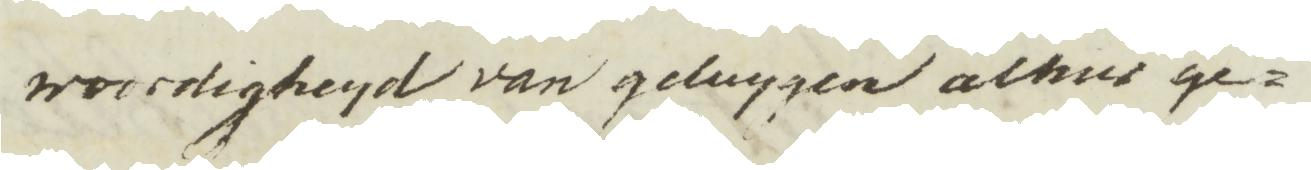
woordigheyd van getuijgen alhier ge=
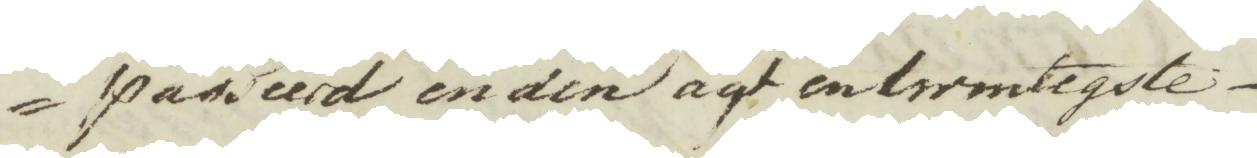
=passeerd en den agt entwintigste-
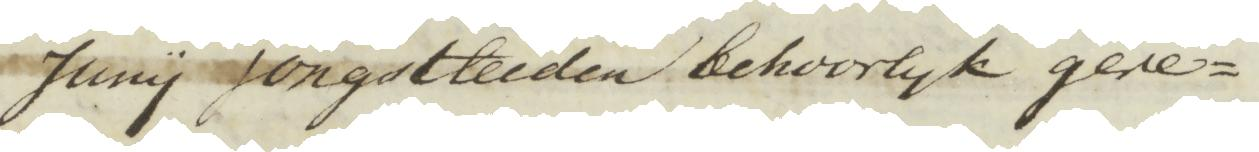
Junij jongstleeden behoorlyk gere=
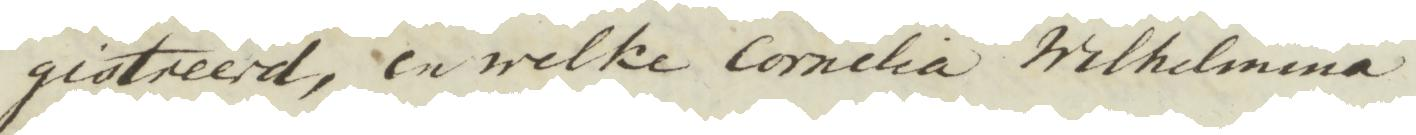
gistreerd, en welke Cornelia Wilhelmina
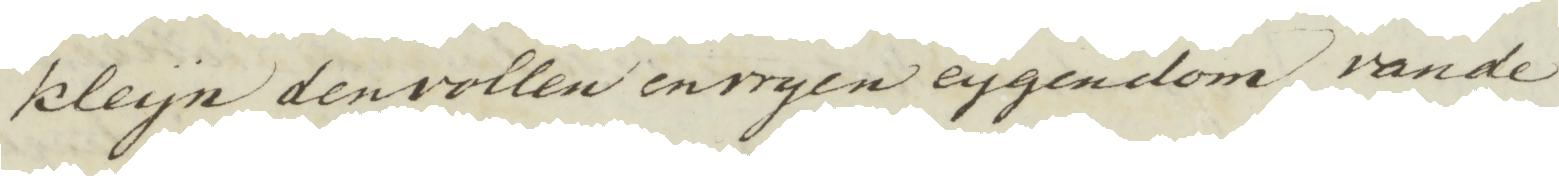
kleijn den vollen en vryen eygendom van de
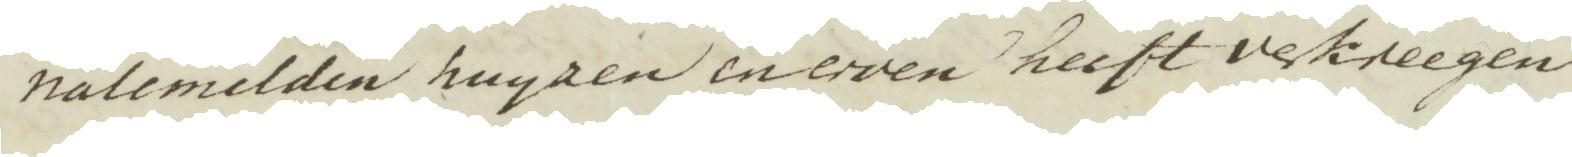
natemelden huyzen en erven heeft verkreegen
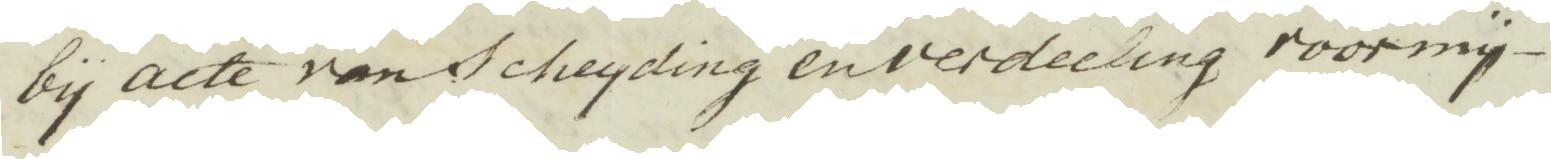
bij acte van Scheyding en verdeeling voor mij-
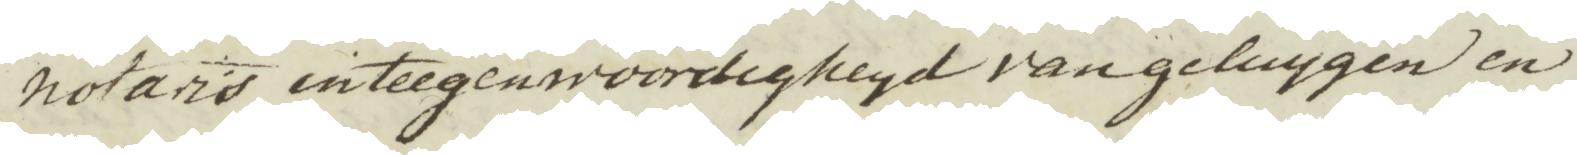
notaris in teegenwoordigheyd van geluygen en
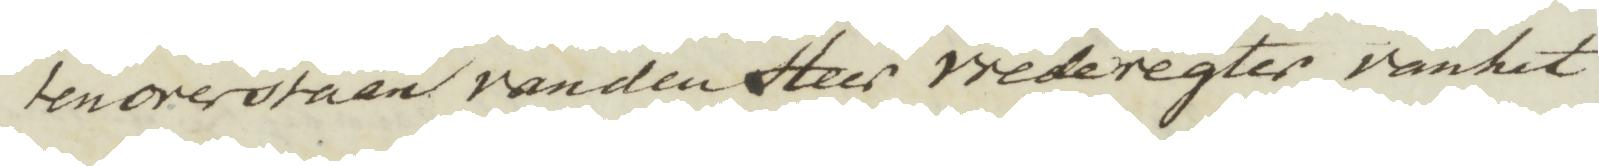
ten overstaan van den Heer vrederegter vanhet
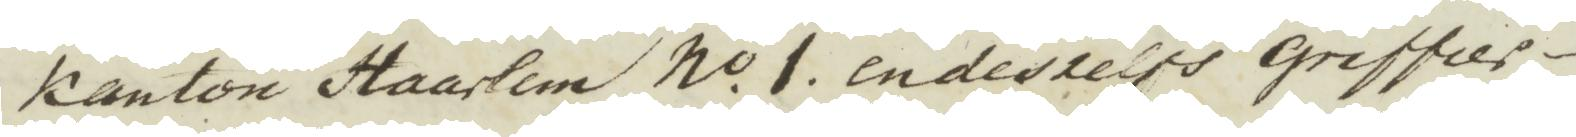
kanton Haarlem No 1. en deszelfs griffier-
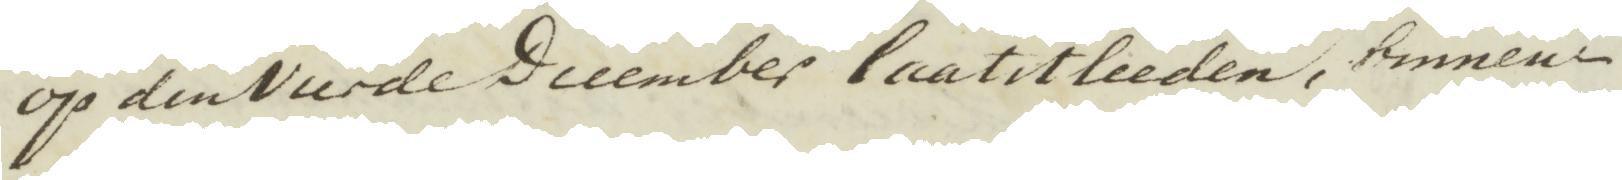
op den vierde December laatstleeden, binnen
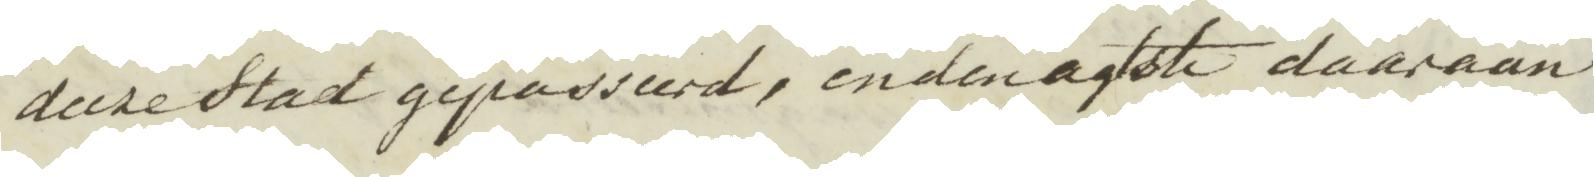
deeze Stad gepasseerd, en den agtste daaraan
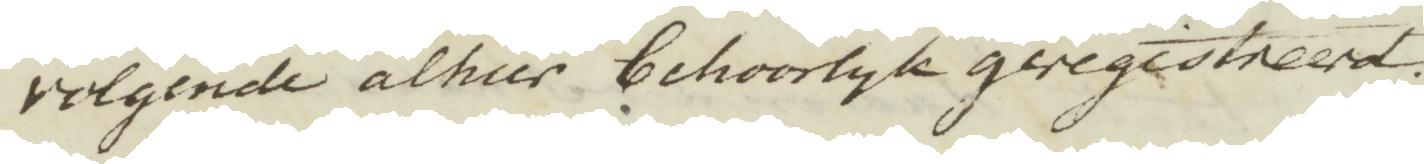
volgende alhier behoorlyk geregistreerd.
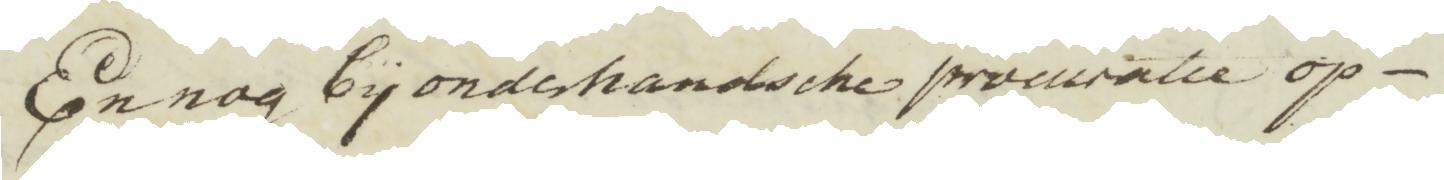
En nog bij onderhandsche procuratie op
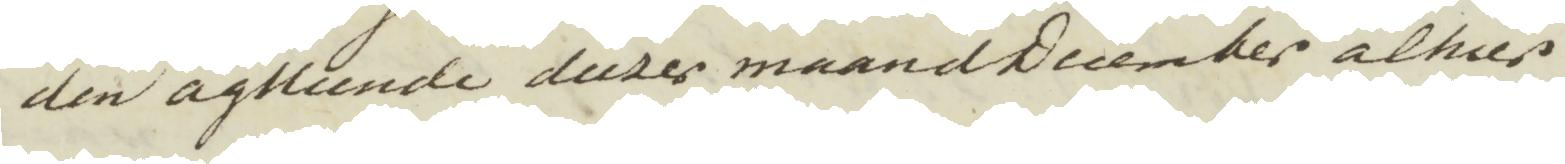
den agttiende deezer maand December alhier
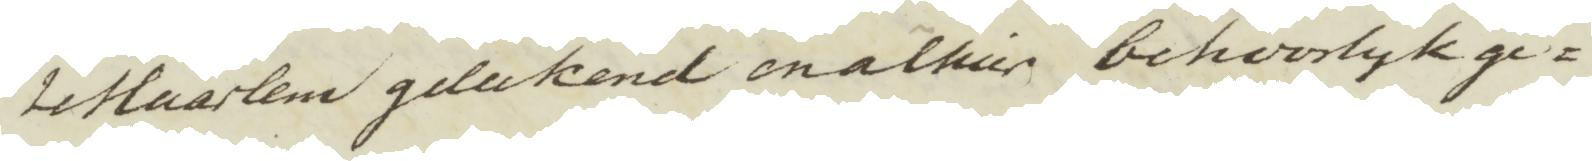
te Haarlem geleekend en alhier behoorlyk ge=
